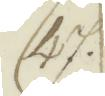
47.
